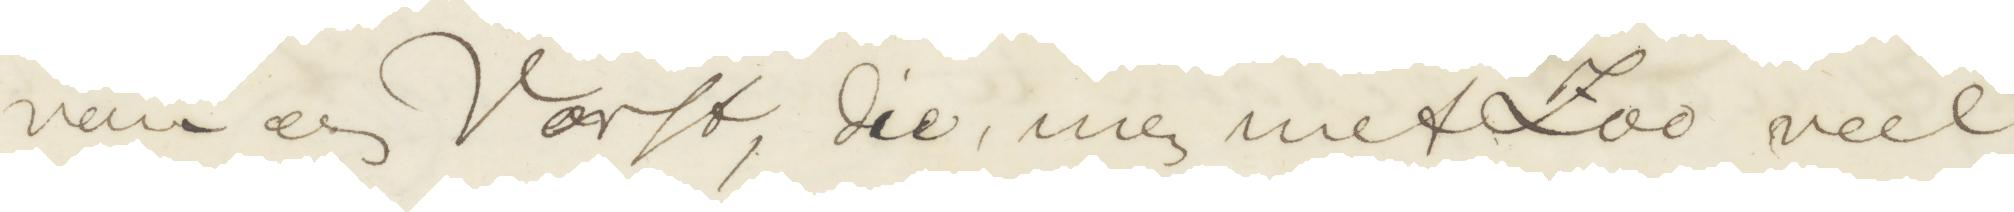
van een Vorst, die, men met zoo veel
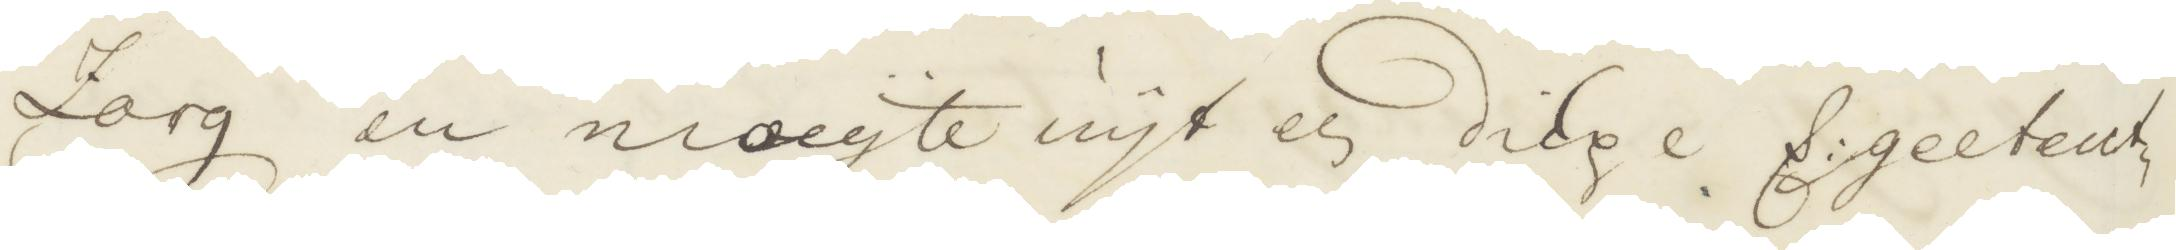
Zorg en moeijte uijt een diepe ver:geetent„
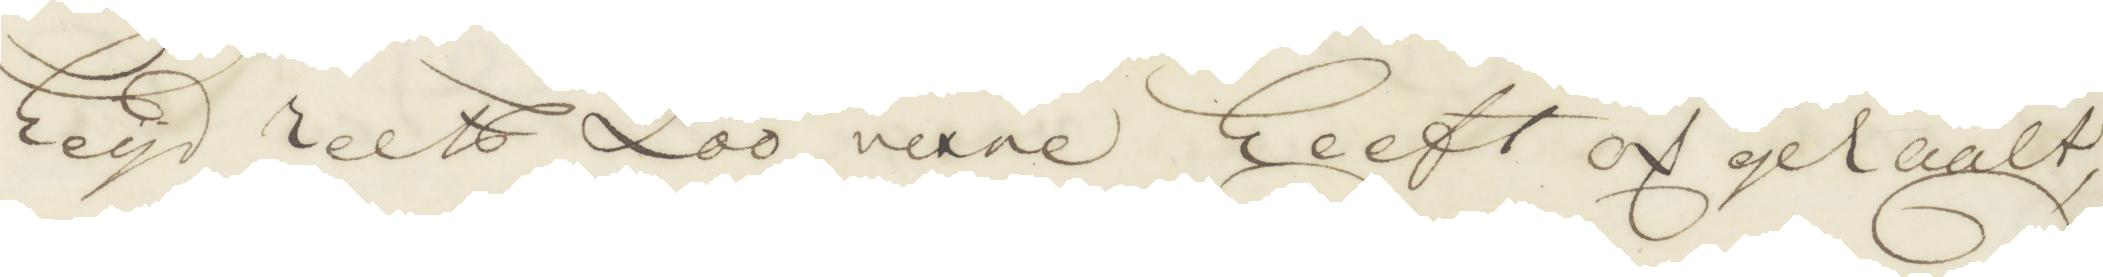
heijd reets Zoo verre heeft over gehaalt,
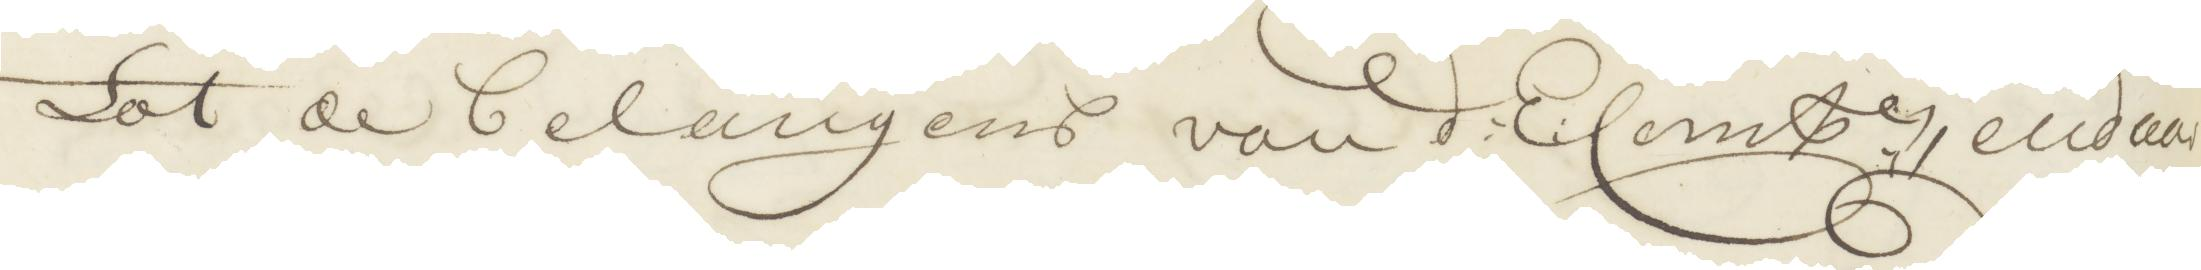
tot de belangens van d: E: Comp„es en daar
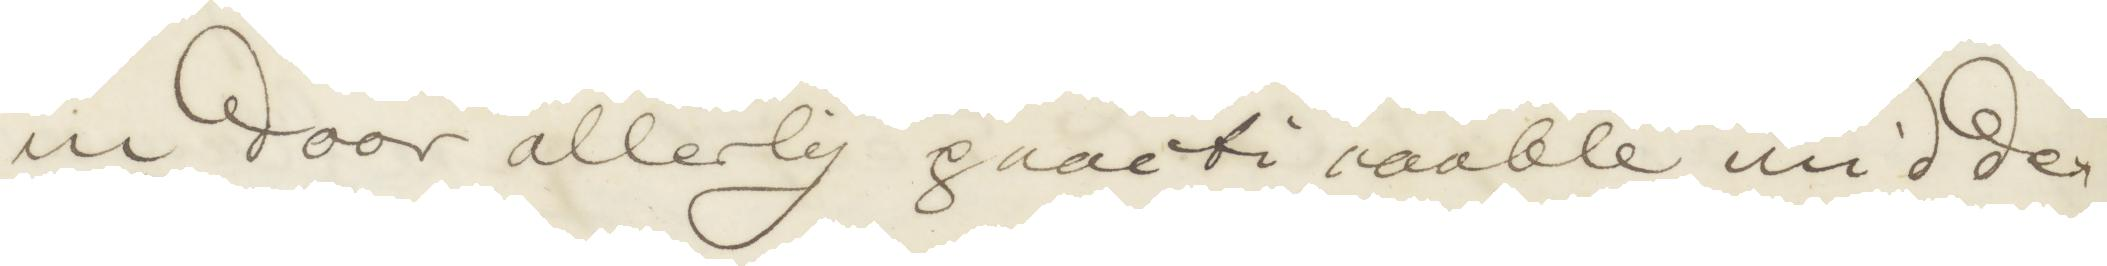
in door allerlij praefiraable midde
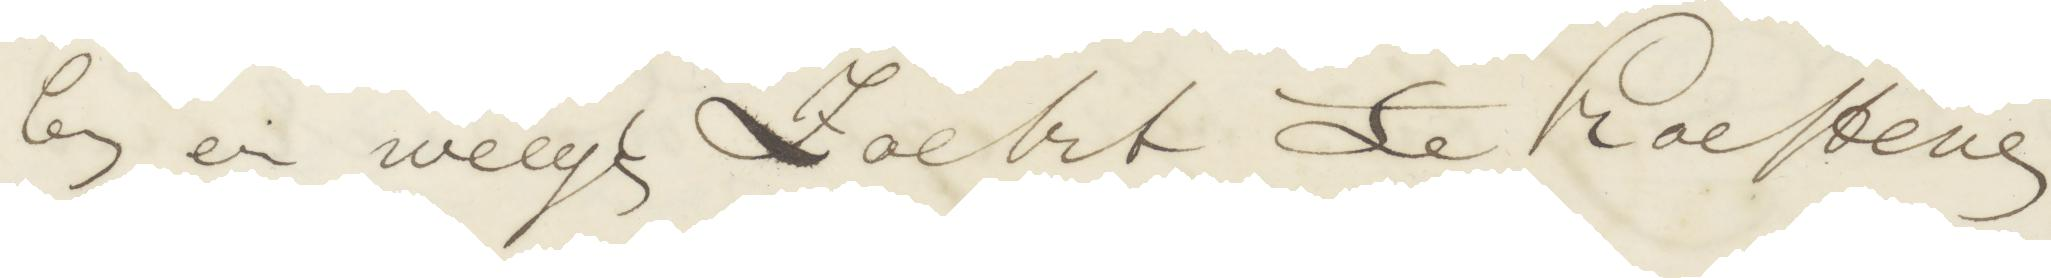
len en weegen zoekt te koesteren
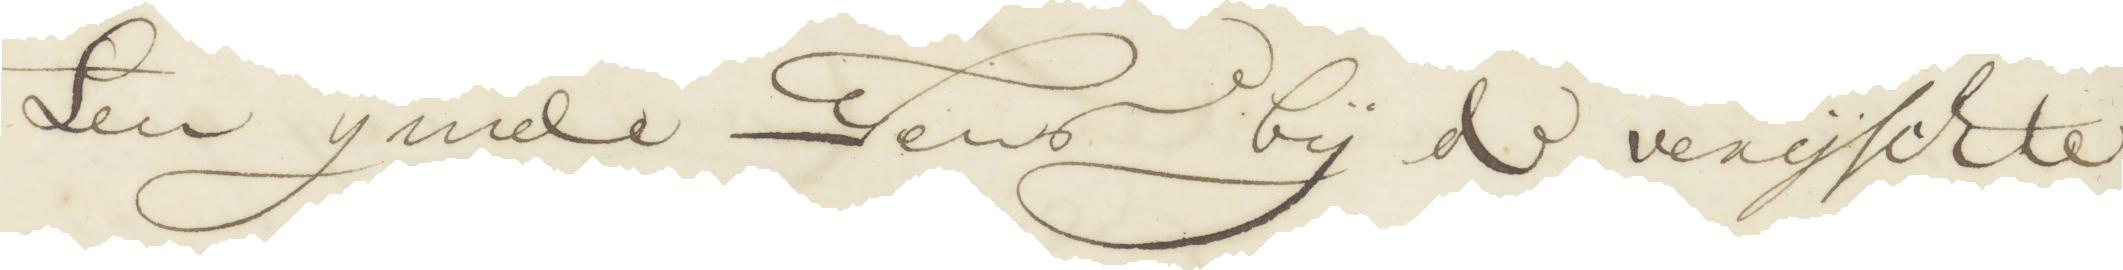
ten ijnde Eens bij de verijschte
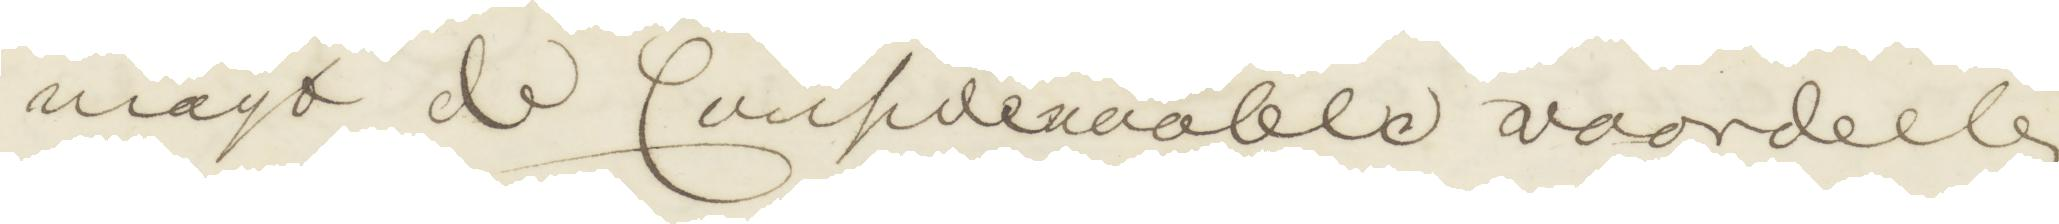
magt de Consideraable voordeelen
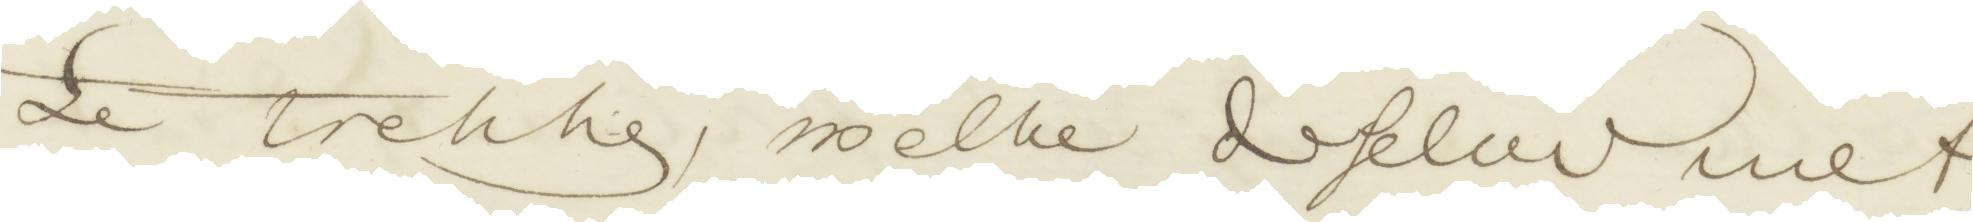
te trekken, welke deselve met
